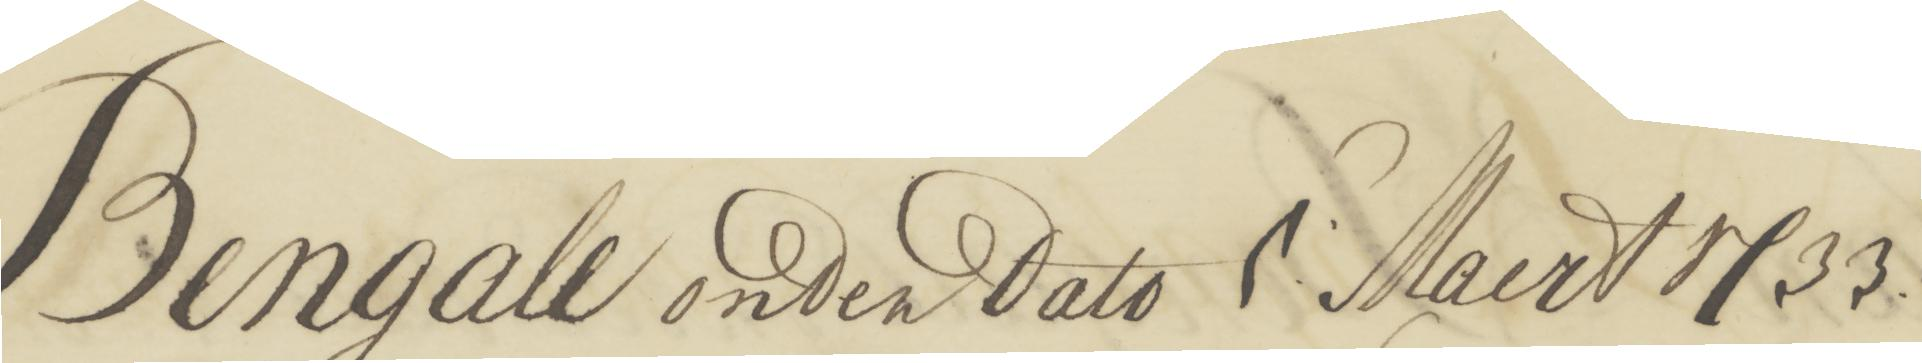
Van Bengale onder dato 5' Maert 1733.
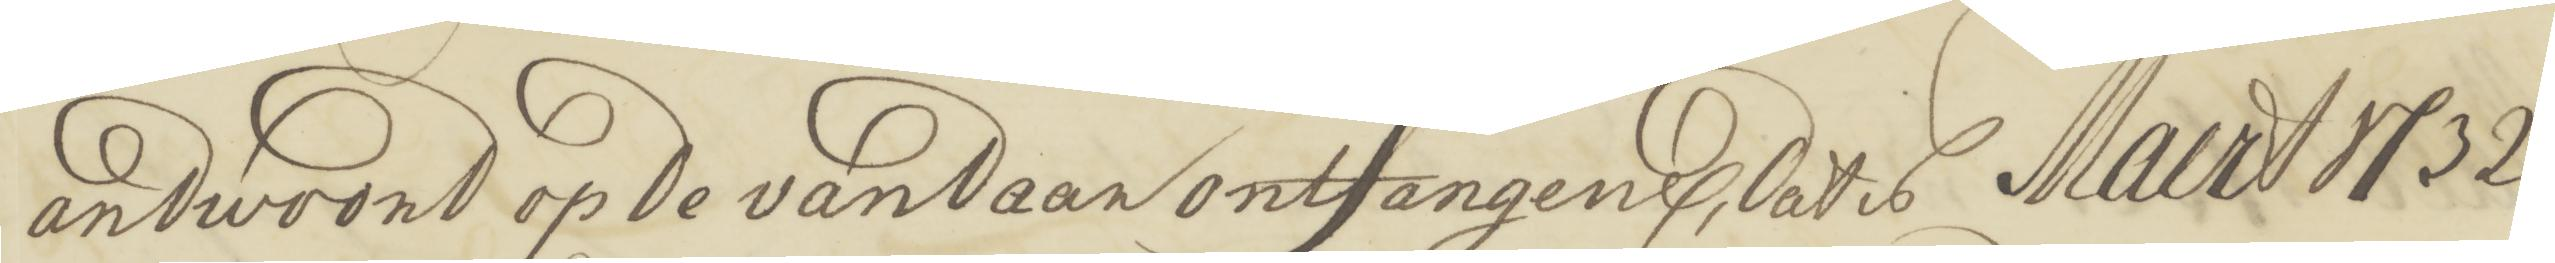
andwoord op de van daar ontfangene, datis Maert 1732
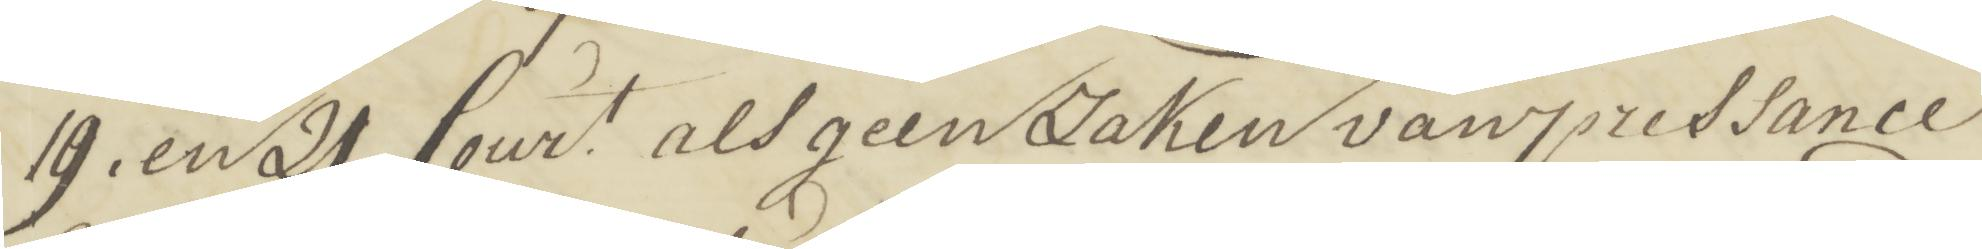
19. en 21 Cour:t als geen zaken van pressance
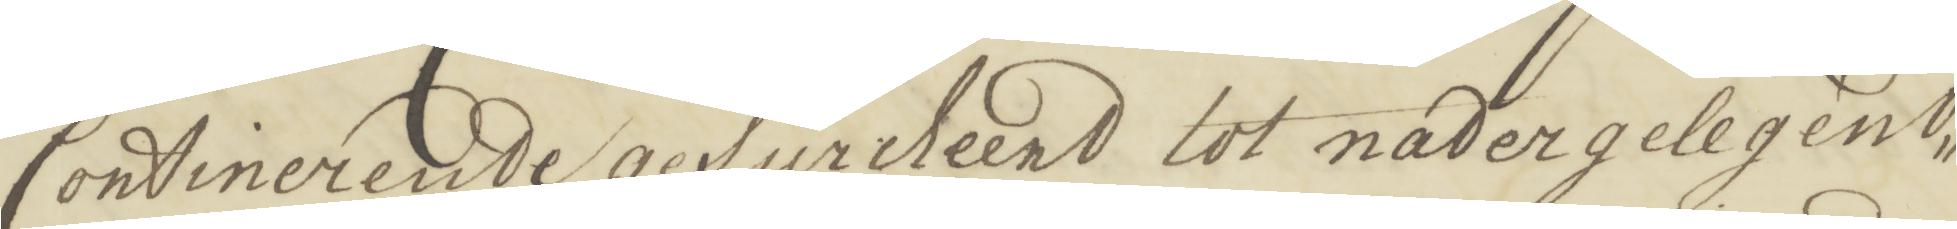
Continerende gesurcheerd tot nader gelegend„
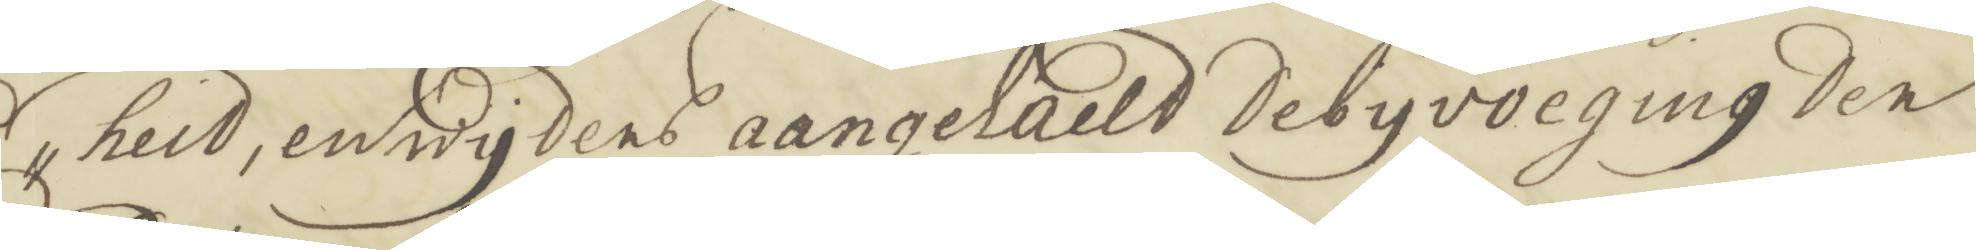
„heid, en wijders aangehaeld de bijvoeging der
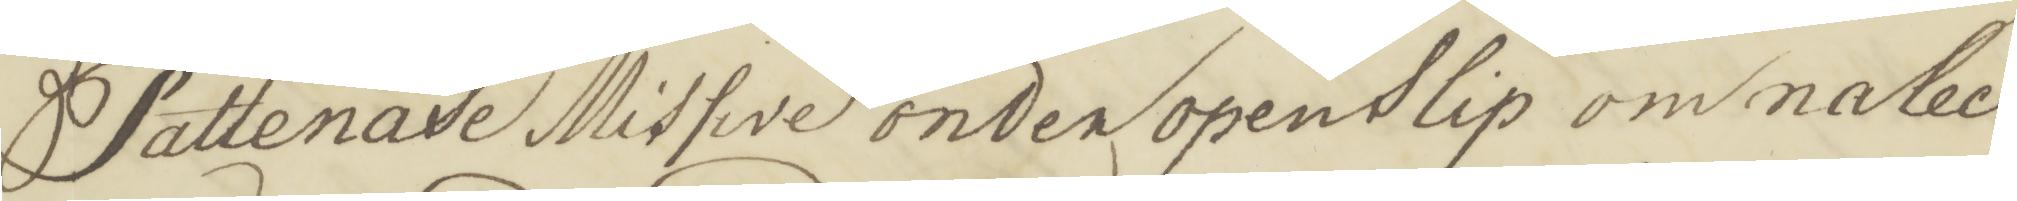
Pattenase Missive onder open slip om na lec
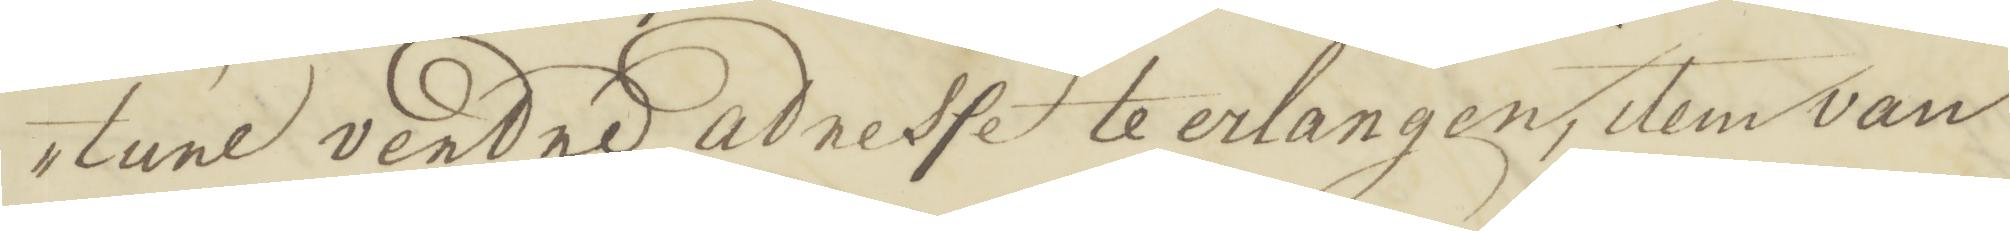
„ture verdre adresse te erlangen, item van
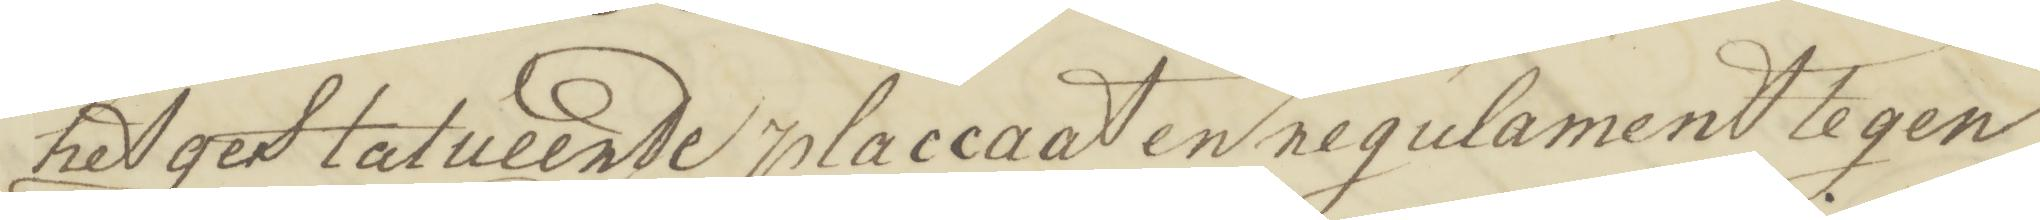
het gestatueerde placcaat en regulament tegen
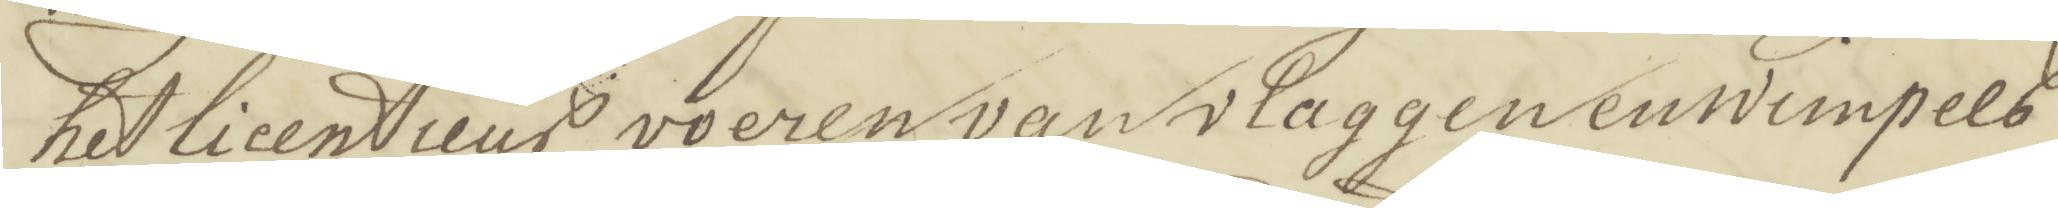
het licentieus voeren van vlaggen en wimpels
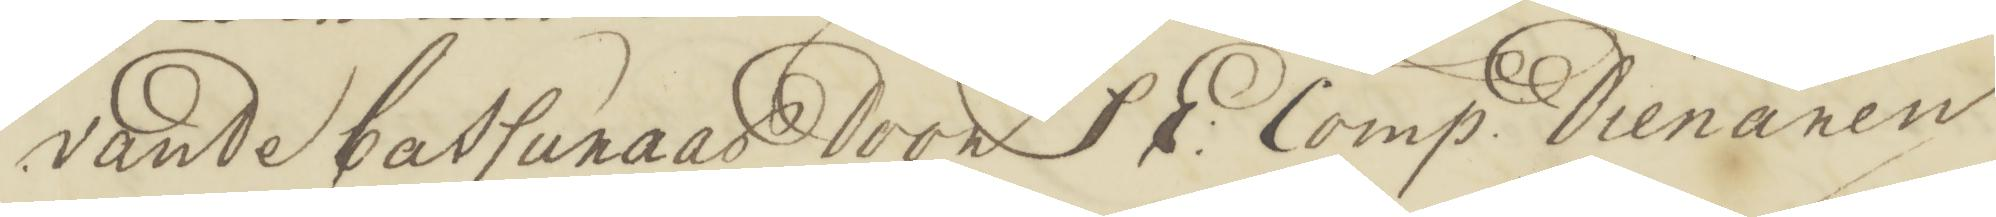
van de bassuraas door 'S E: Comp: dienaren
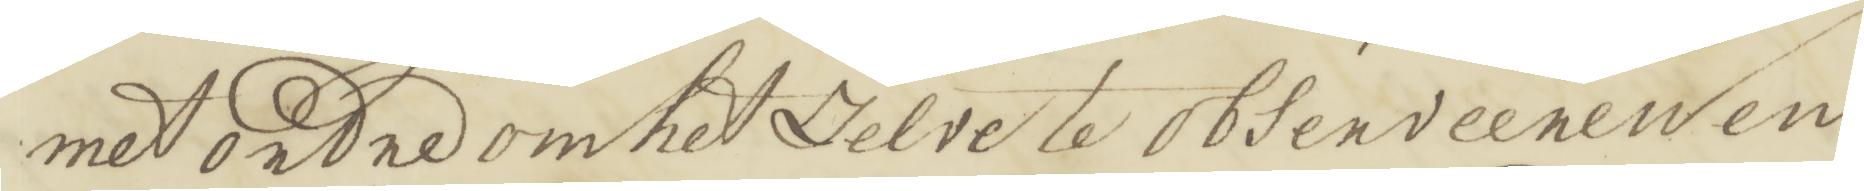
met ordre om het Zelve te observeeren en
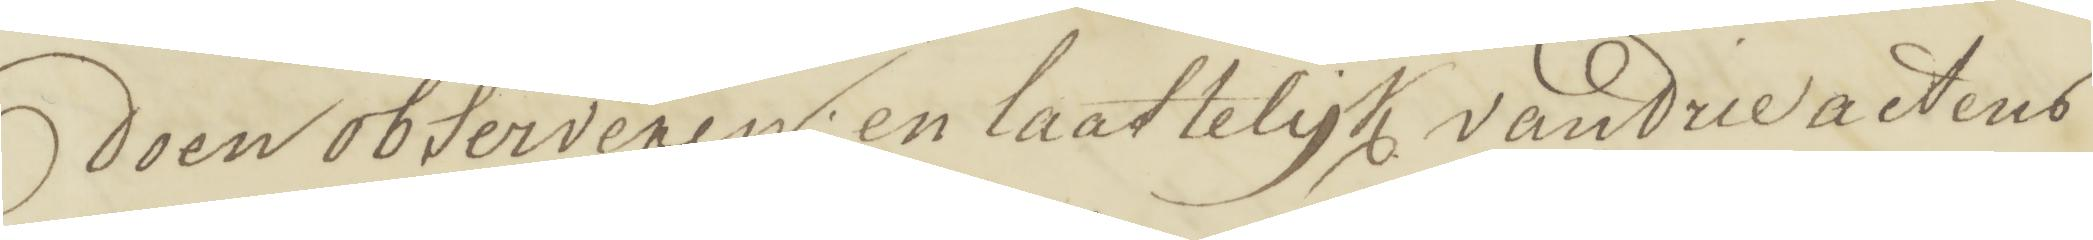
doen observeren en laastelijk van drie actens
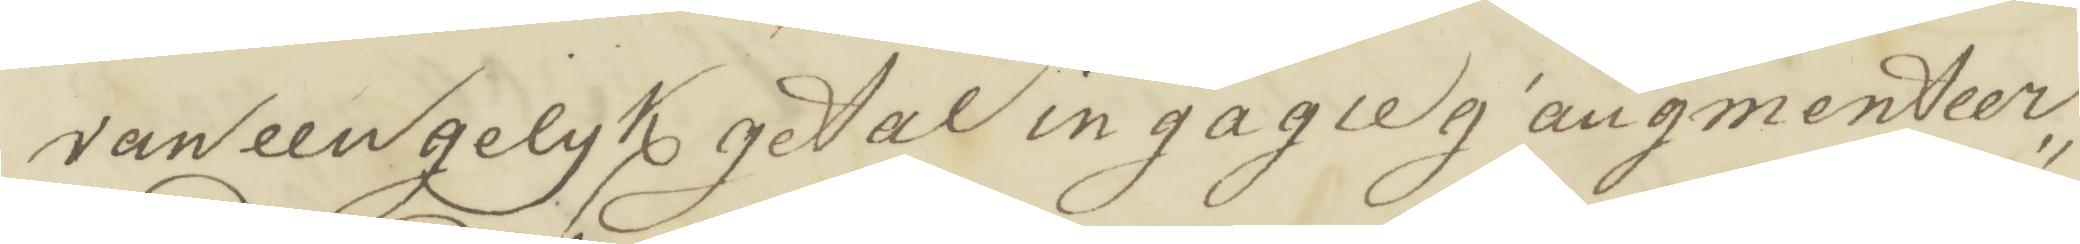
van een gelijk getal in gagie g’augmenteer„
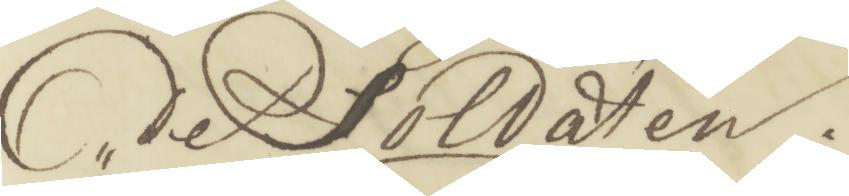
de Soldaten.
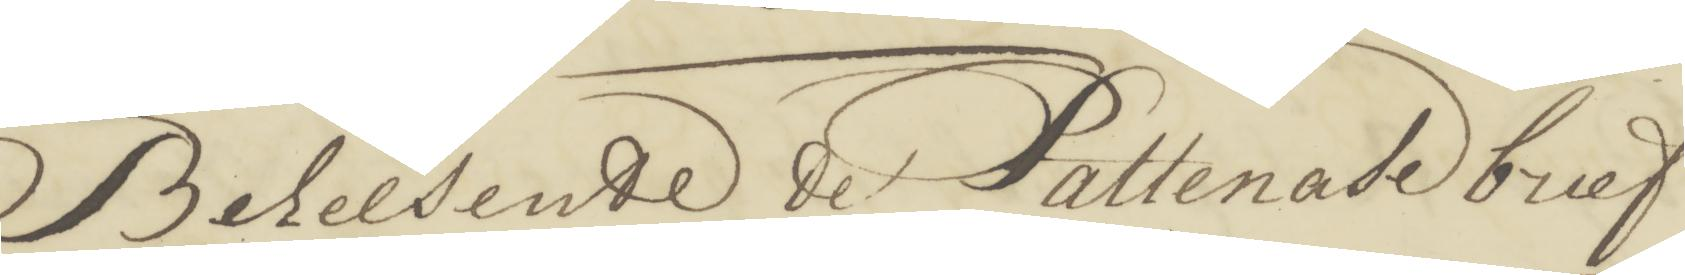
Behelsende de Pattenase brief
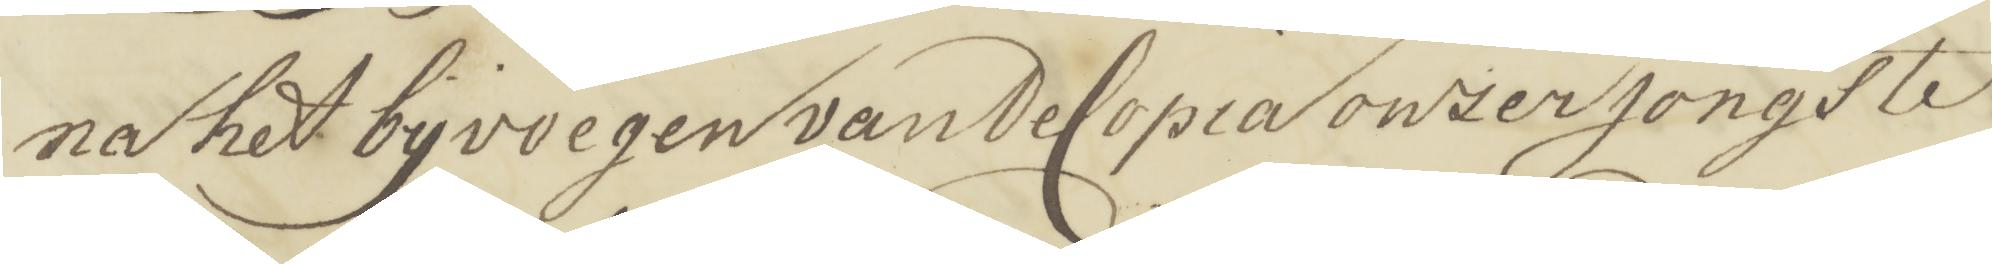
na het bijvoegen van de Copia onzer jongste
